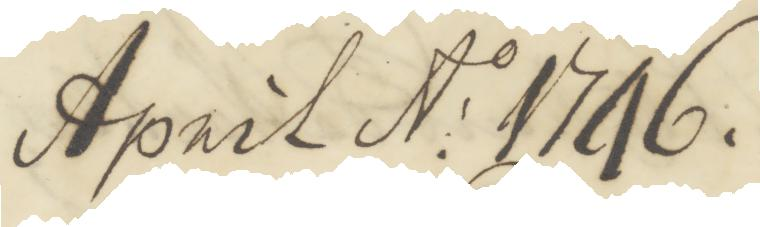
April A:o 1746.
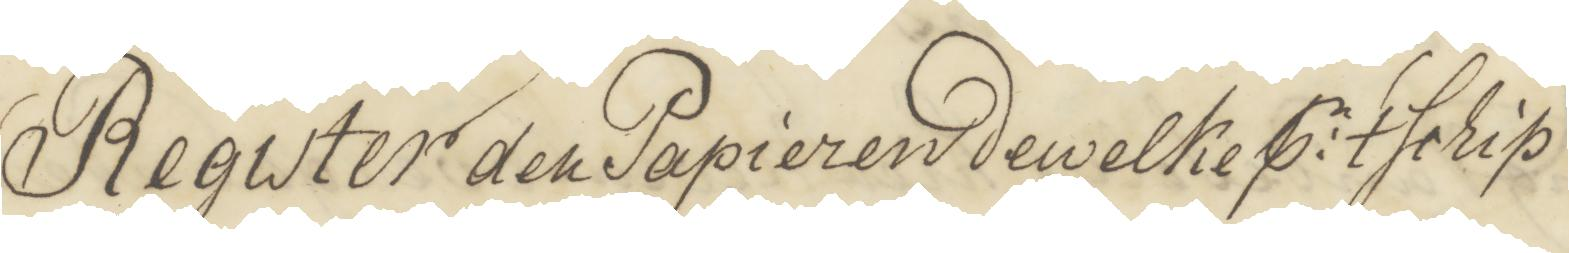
Register der Papieren dewelke p:r ’t schip
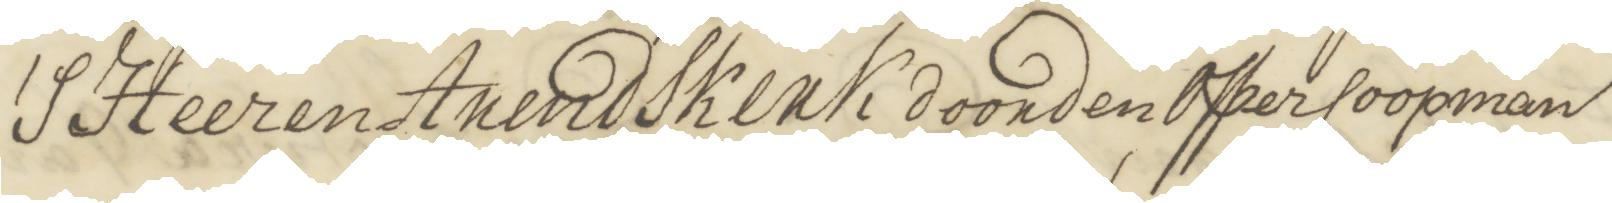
’s Heeren Arendskerk door den oppercoopman
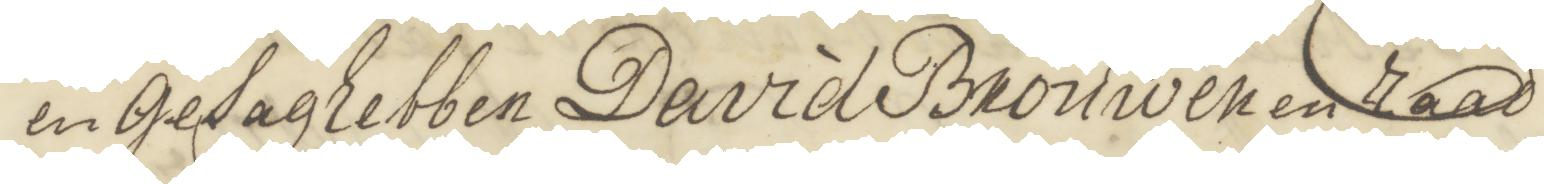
en gesaghebber David Brouwer en raad
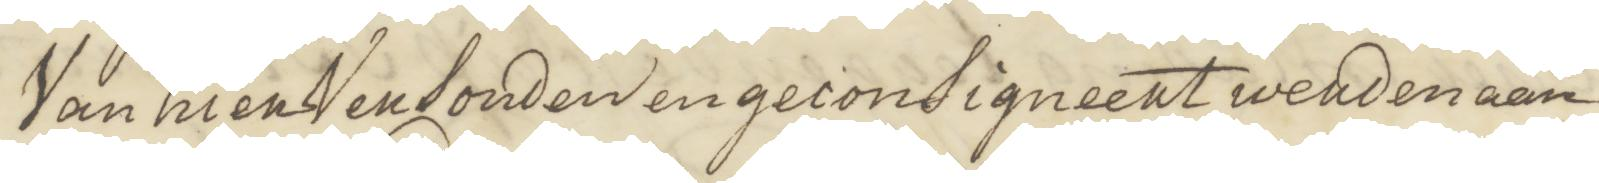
van hier versonden en geconsigneert werden aan
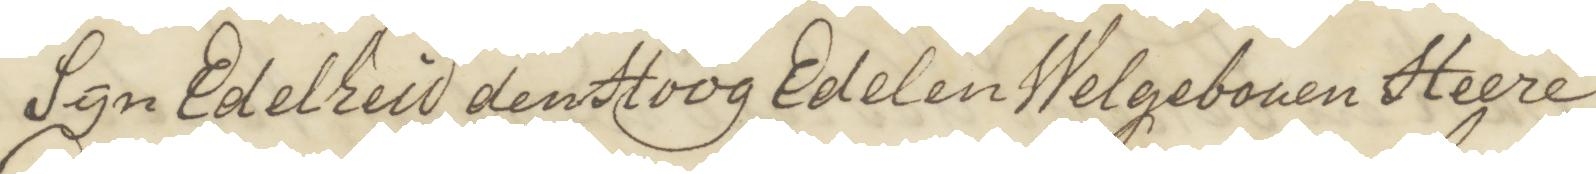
sijn Edelheid den Hoog Edelen Welgeboren Heere
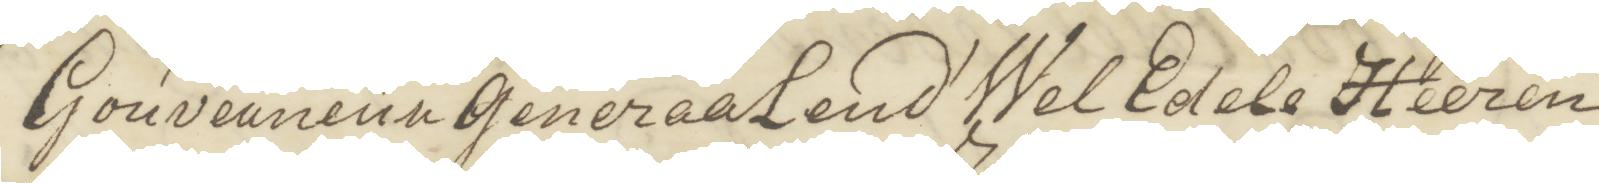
Gouverneur generaal end' Wel Edele Heeren
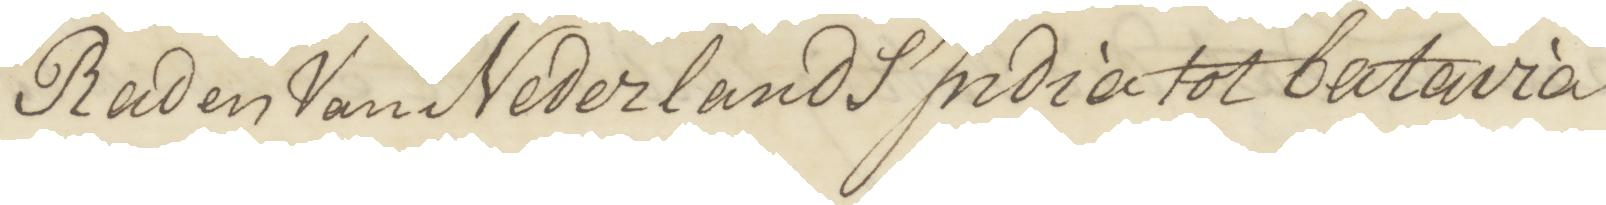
Raden van Nederlands Jndia tot batavia
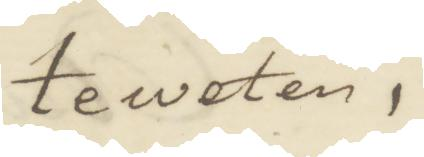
te weten,
